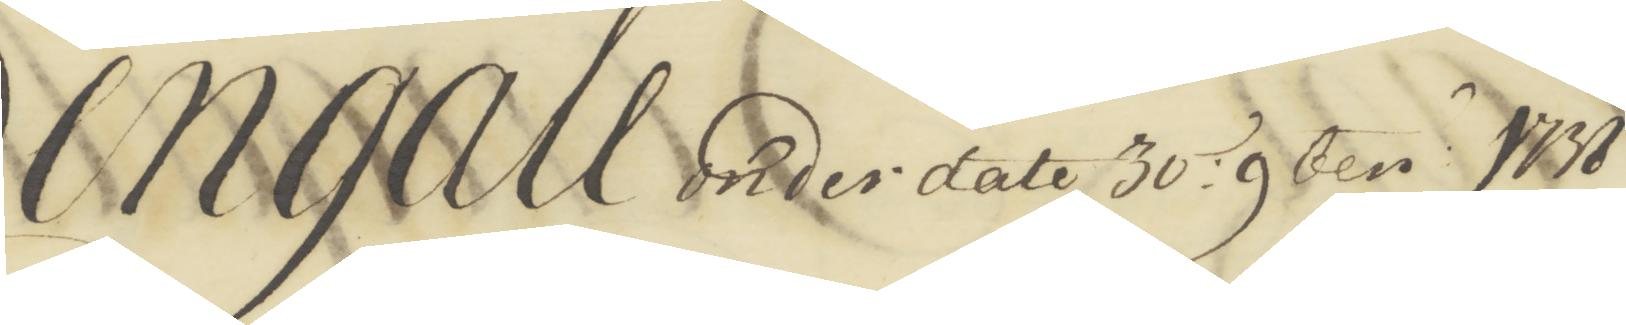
Van Bengale onder dato 30:' 9ber: 1738
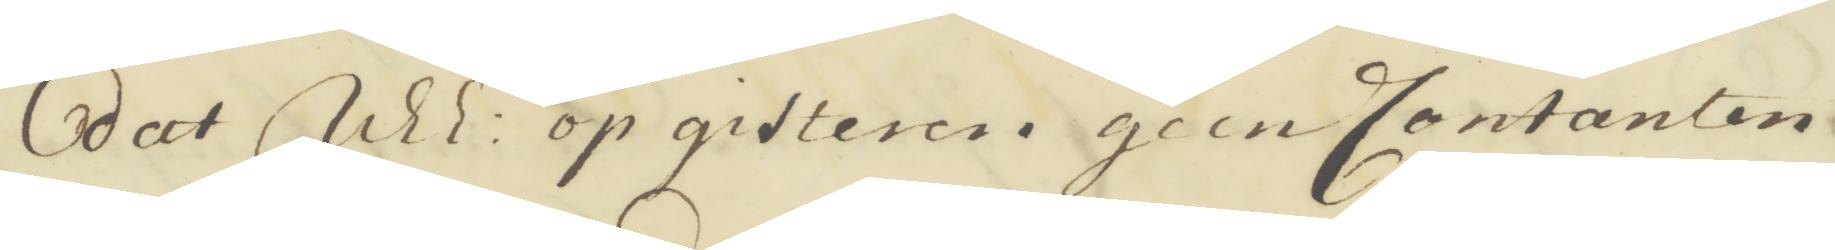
dat UEh: op gisteren geen Contanten
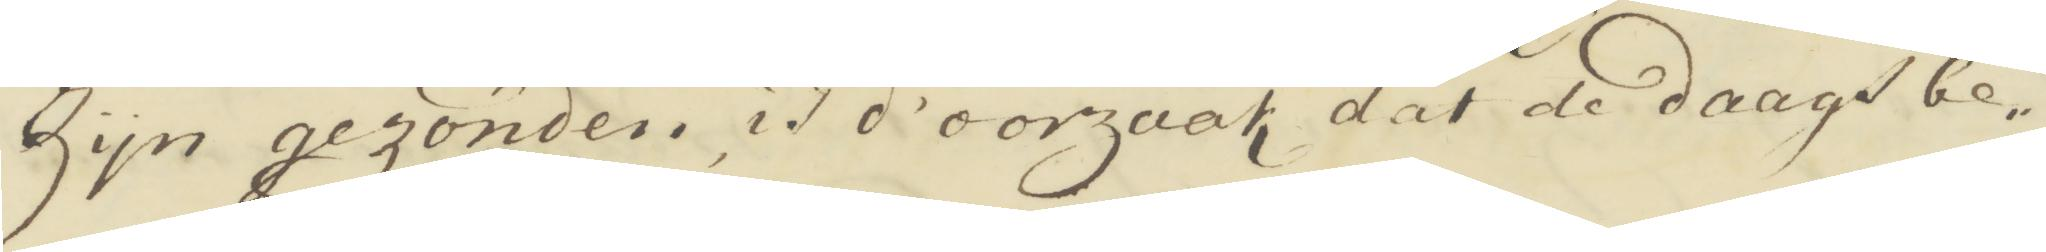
zijn gezonden, is d'oorzaak dat de daags be„
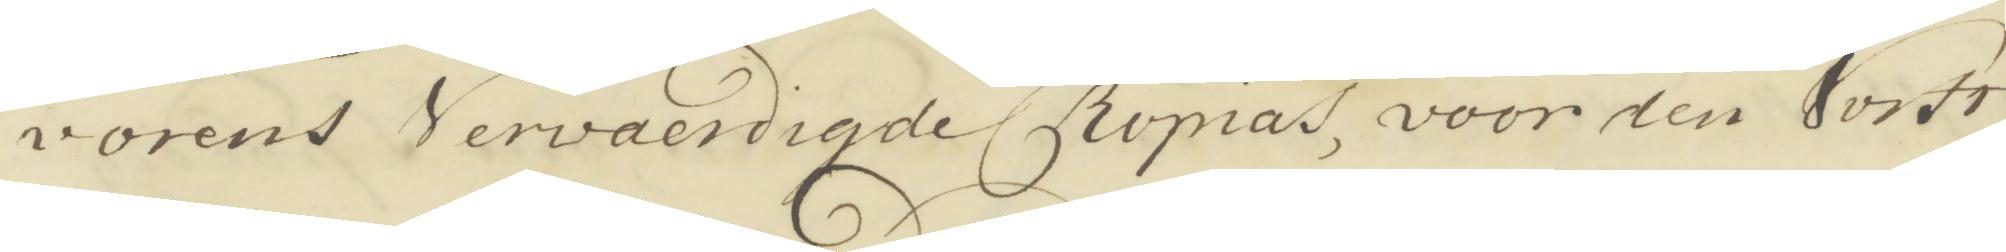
vorens Vervaerdigde Ropias, voor den vorst
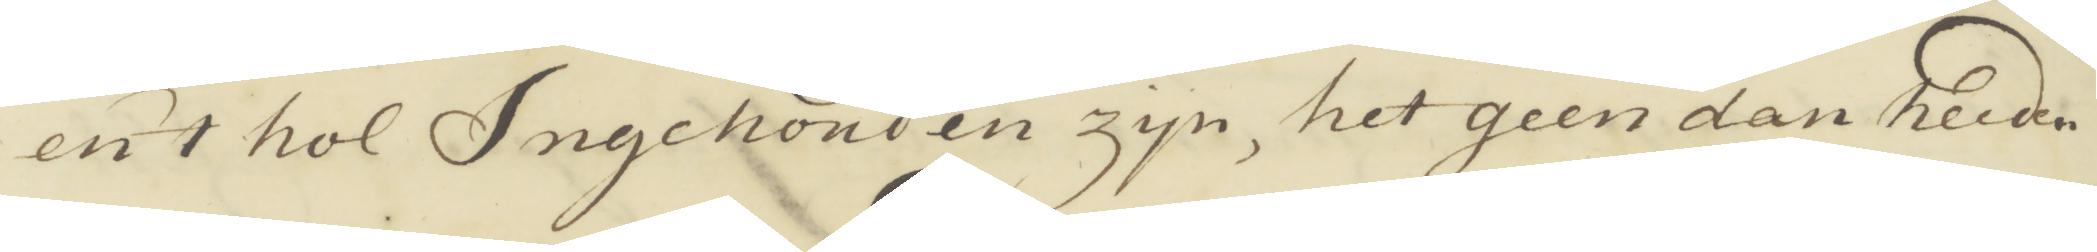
en' thol Ingehouden zyn, het geen dan weder
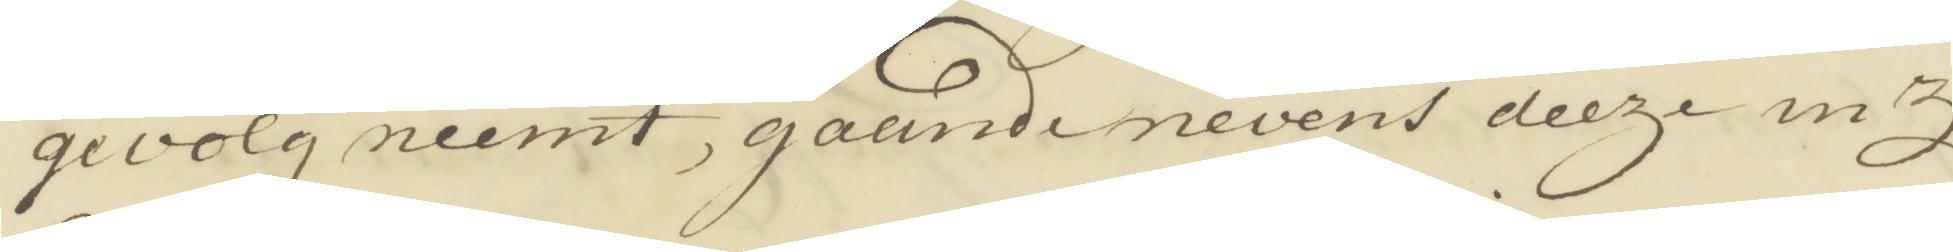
gevolg neemt, gaande nevens deeze in 3
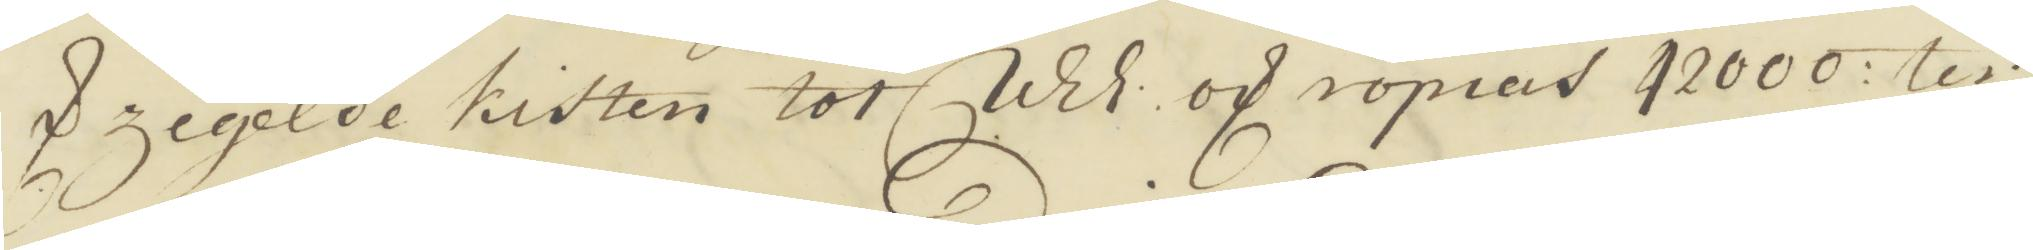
verzegelde kisten tot UEh: over ropias 42000: ter„
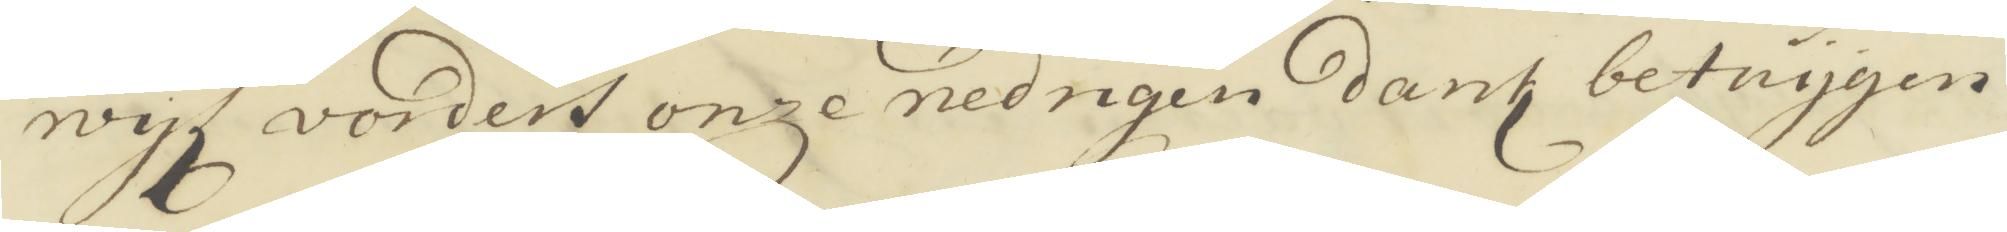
wijl vorders onze nedrigen dank betuijgen
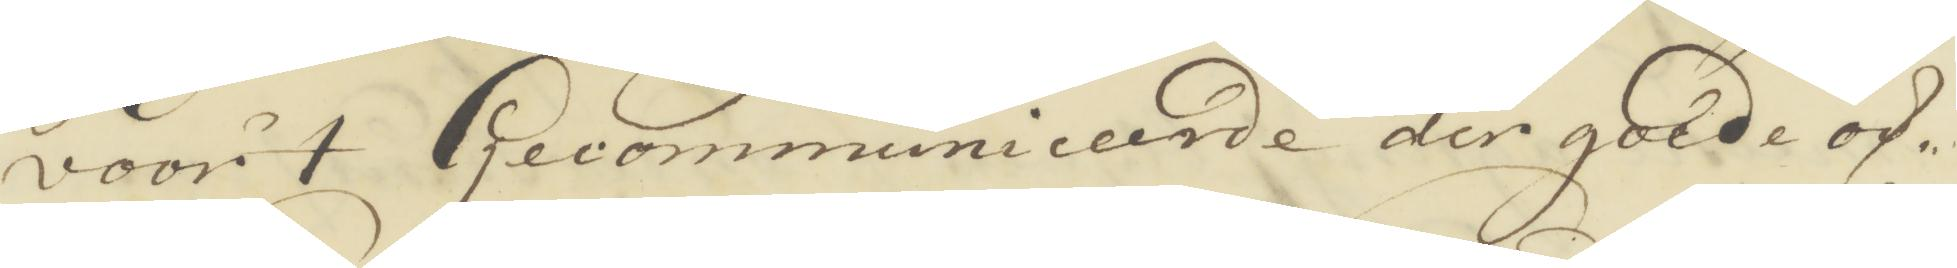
voor ’t Gecommuniceerde der goede over„
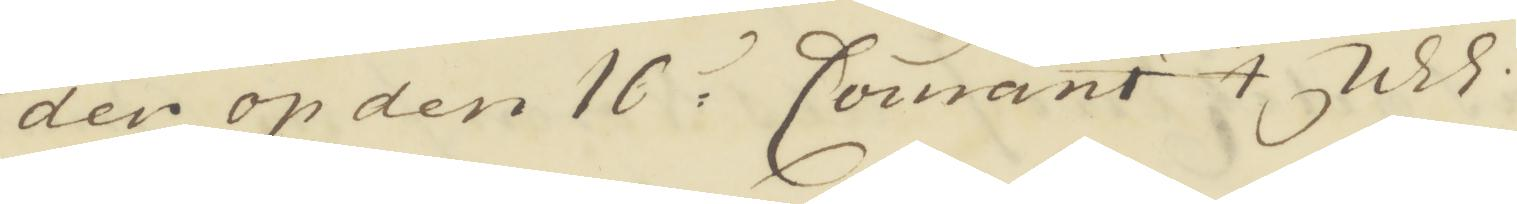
brengh der op den 16:' Courant 't UEh:
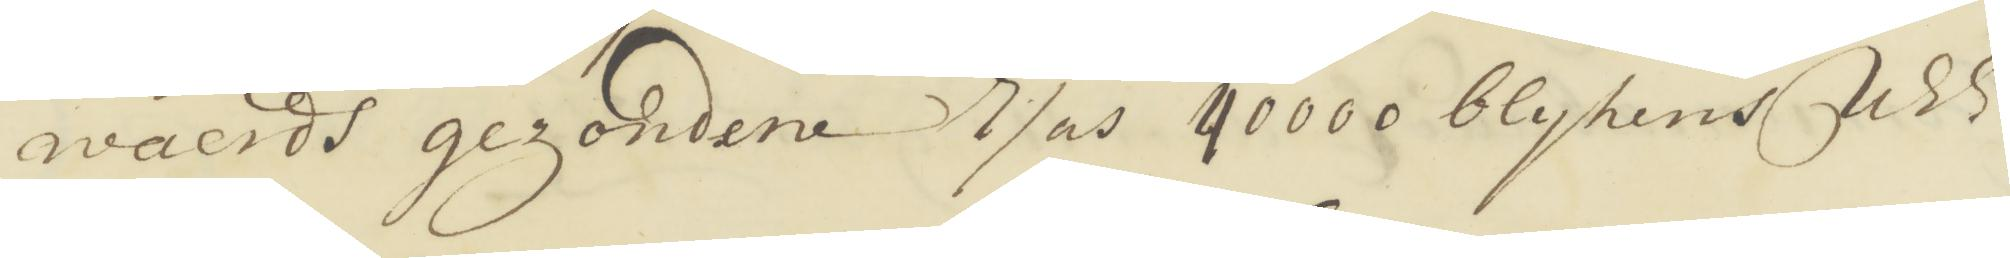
waerds gezondene r/as 40000 blykens uEh
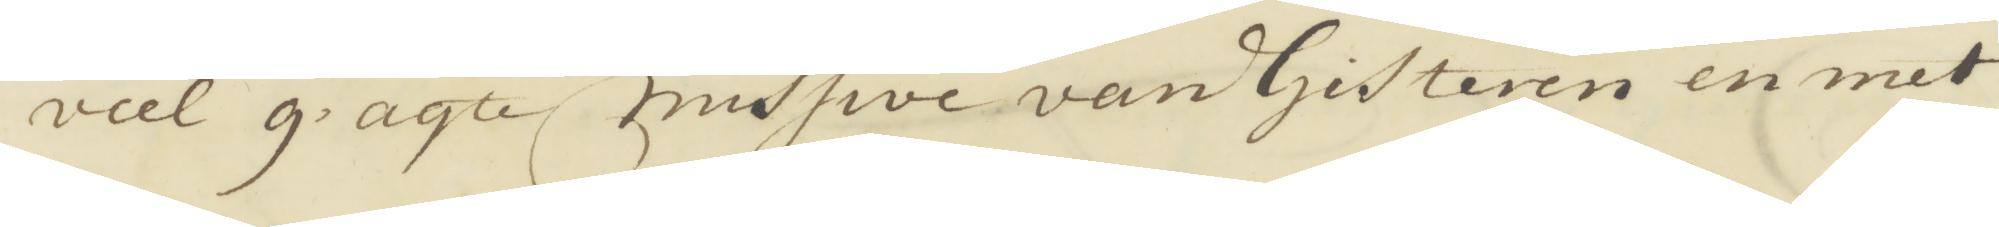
veel g'agte missive van Gisteren en met
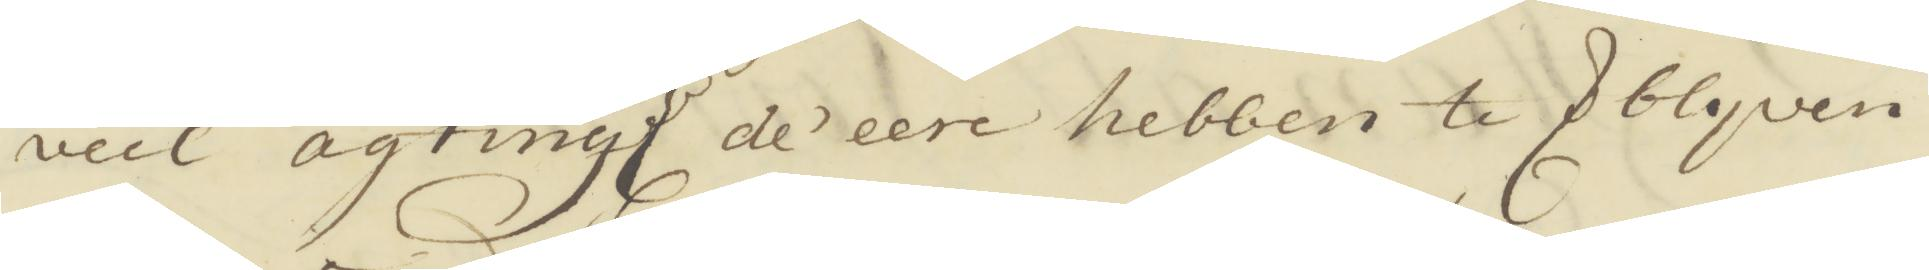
veel agtingh de' eere hebben te verblyven
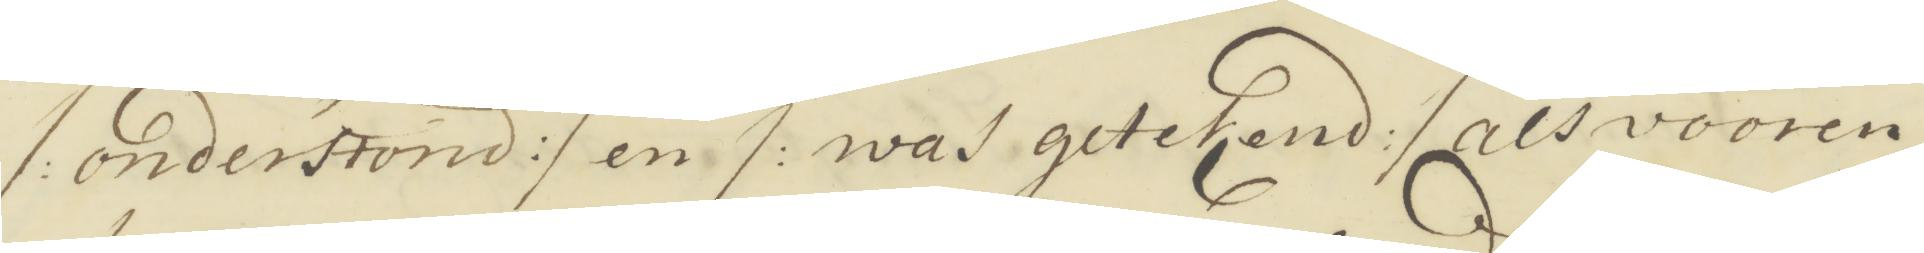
/: onderstond :/ en /: was getekend :/ als vooren
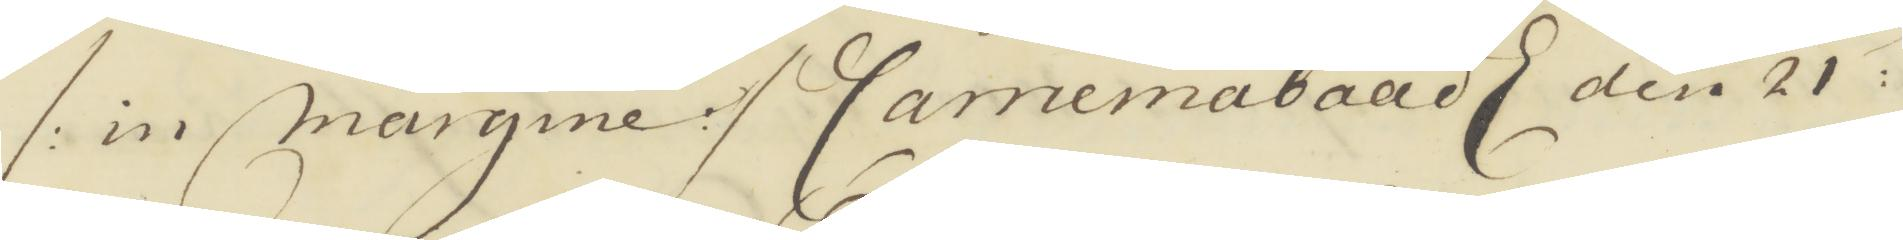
/: in margine :/ Carriemabaadh den 21:'
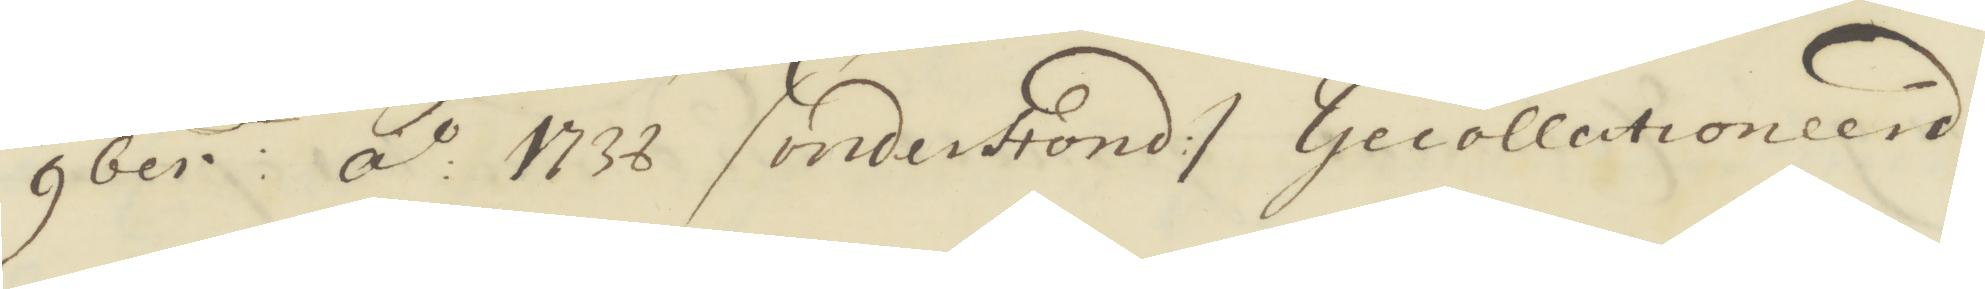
9ber: a:o 1738 / onderstond :/ Gecollationeerd
